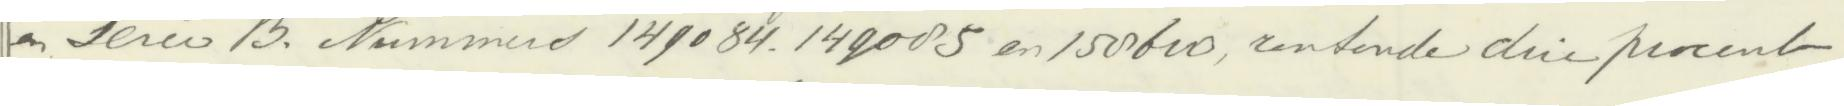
en Serie B. Nummers 149084. 149085 en 158610, rentende drie procent
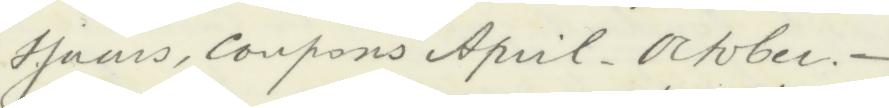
sjaars, coupons April - October.
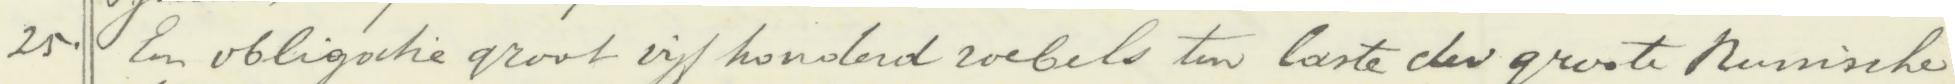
25. Een obligatie groot vijf honderd roebels ten laste der groote Russische
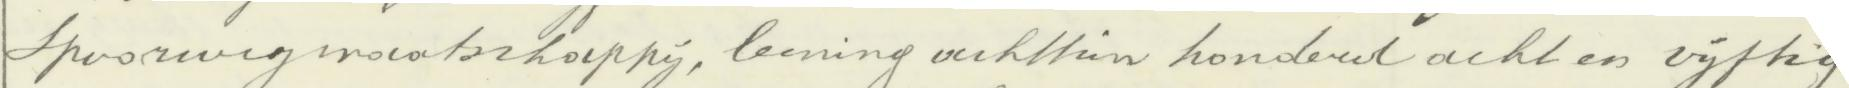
Spoorwegmaatschappij, leening achttien honderd acht en vijftig
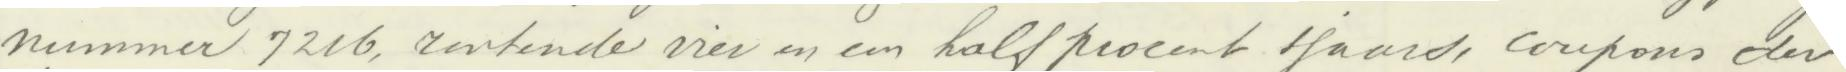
nummer 7216, rentende vier en een half procent sjaars, coupons der
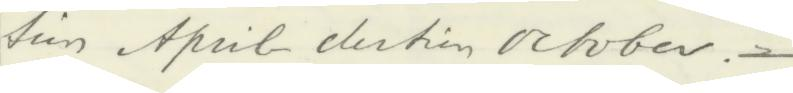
tien April dertien october.
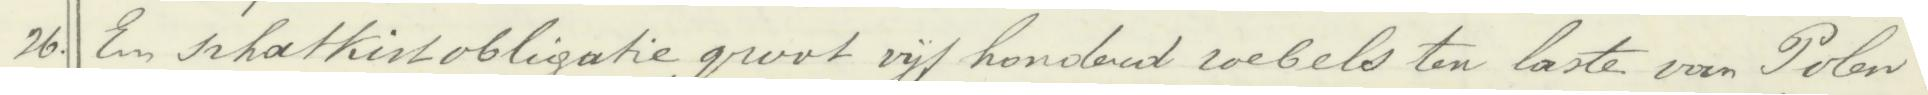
26. En schatkistobligatie groot vijf honderd roebels ten laste van Polen
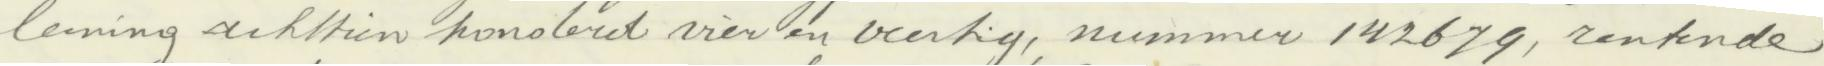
leening achttien honderd vier en veertig, nummer 142679, rentende
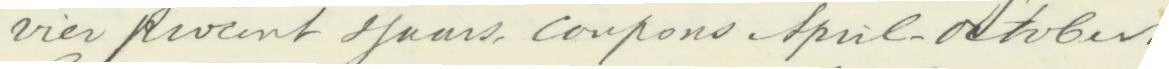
vier procent sjaars, coupons April - October.
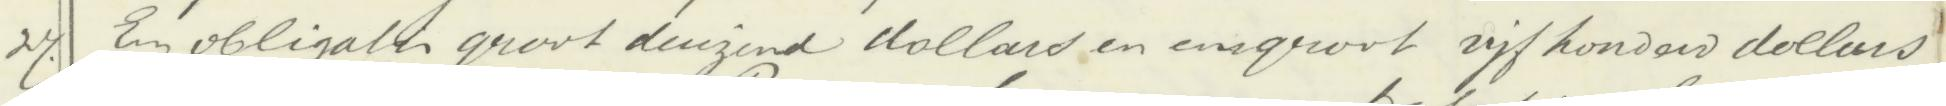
27. Een obligatie groot duizend dollars en een groot vijf honderd dollars
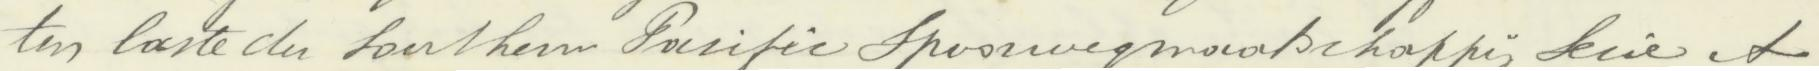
ten laste der Southern Pasific Spoorwegmaatschappij Secie A
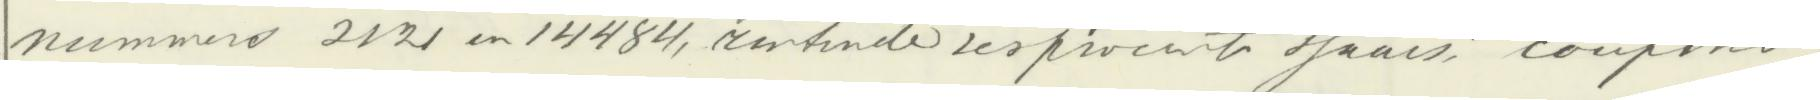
nummers 2121 en 14484, rentende zes procent sjaars coupons
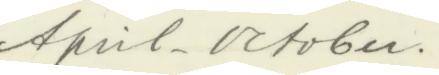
April - October.
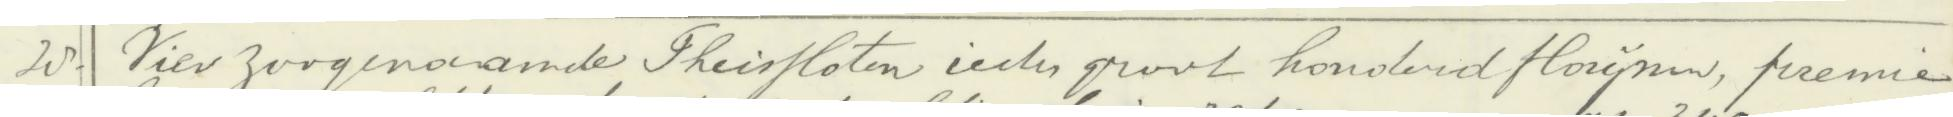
28. Vier zoogenaamde Thuisloten ieder groot honderd florijnen, premie
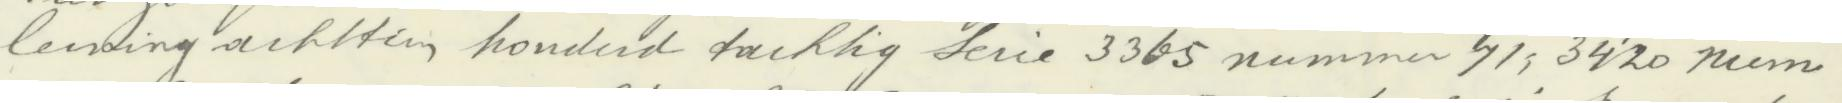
leening achttien honderd tachtig Serie 3365 nummer 71: 3420 num
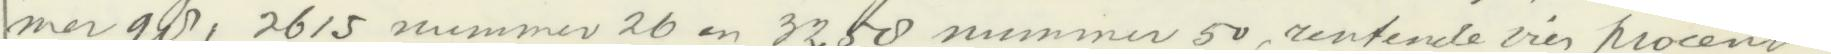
mer 48, 2615 nummer 26 en 3258 nummer 50, rentende vier procent
